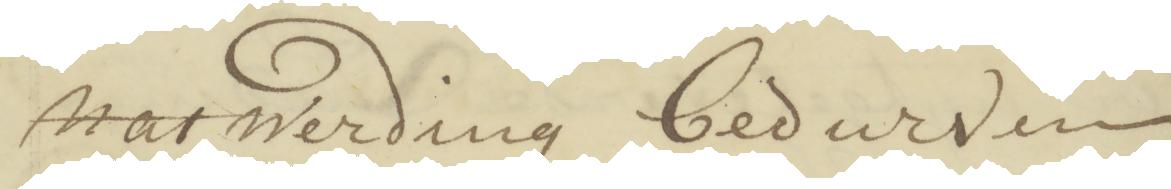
nat werding bedurven
